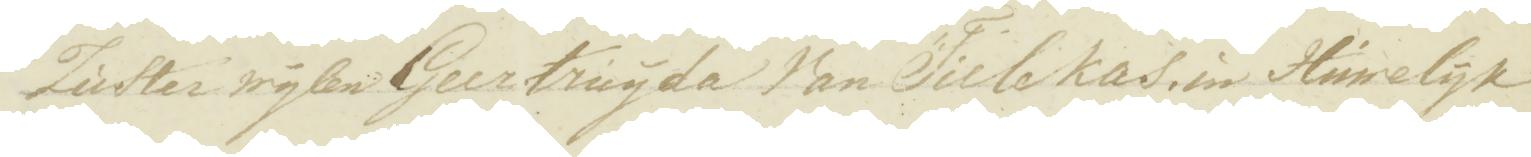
Zuster wijlen Geertruijda Van Tielekas, in Huwelijk
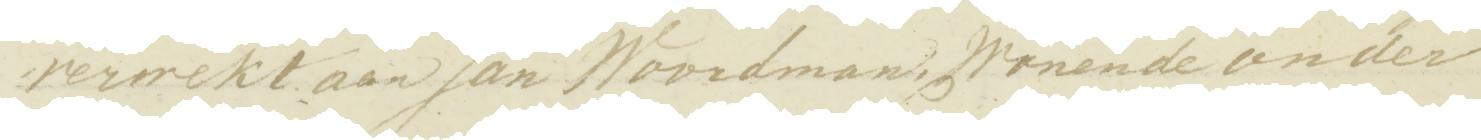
verwekt aan Jan Woordman, Wonende onder
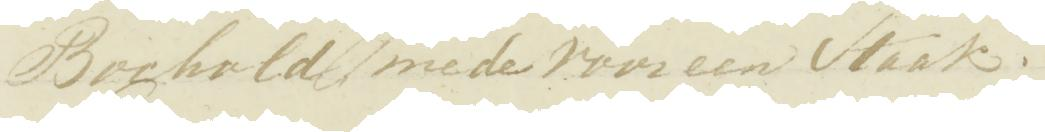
Bochold mede voor een staak.
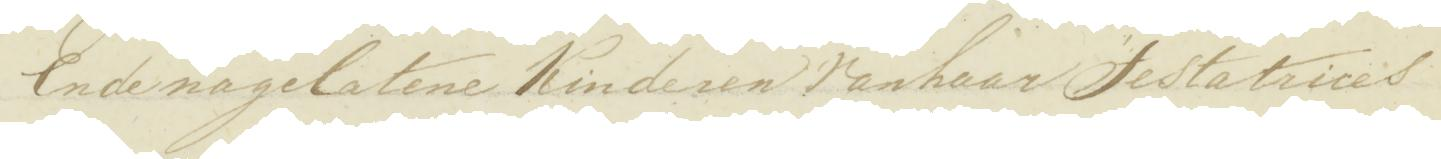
Ende nagelatene kinderen van haar Testatrices
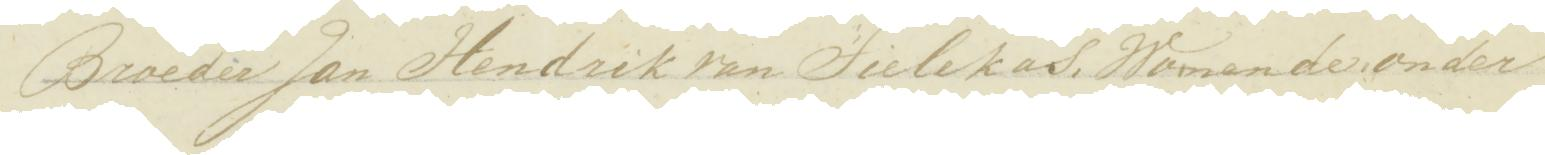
Broeder Jan Hendrik van Tielekas, Wonende, onder
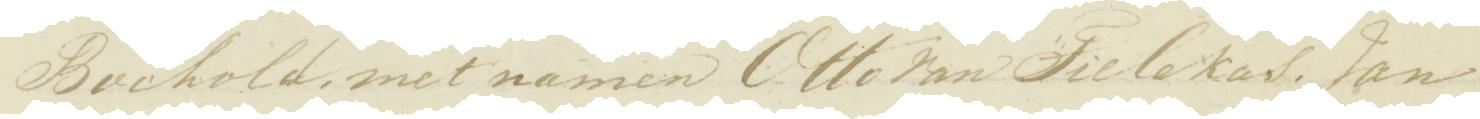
Bochold, met namen Otto van Tielekas, Jan
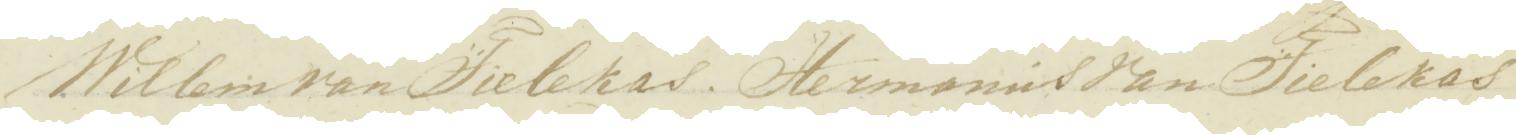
Willem van Tielekas, Hermanus van Tielekas,
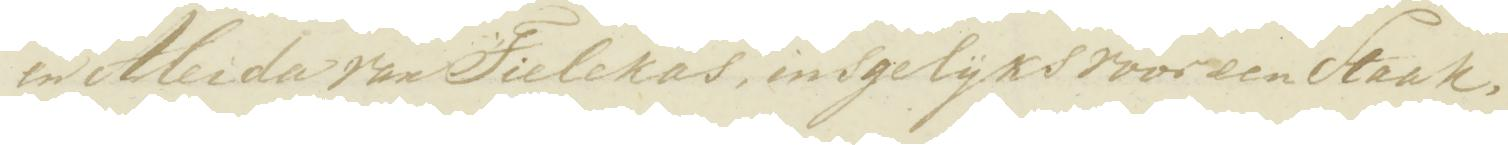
en Aleida van Tielekas, insgelijks voor een staak,
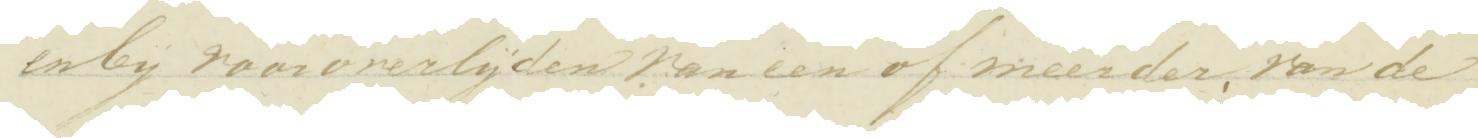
en bij vooroverlijden van een of meerder, van de
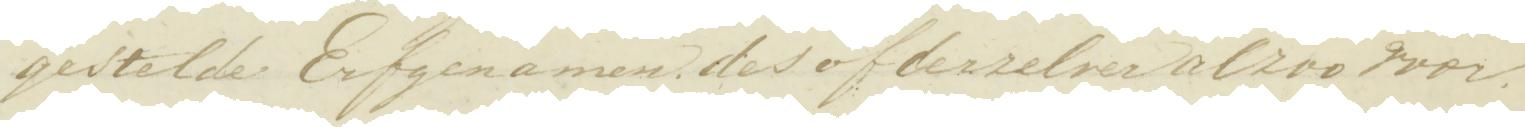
gestelde Erfgenamen, des of derzelver alzoo voor
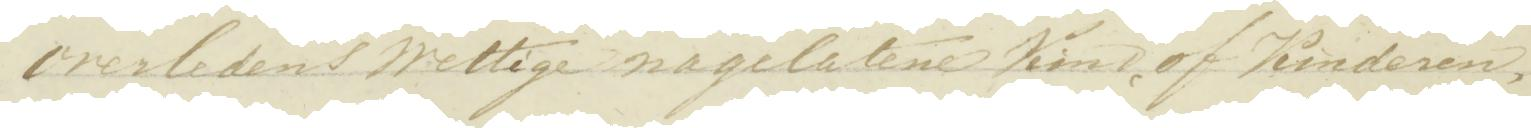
overledens wettige nagelatene kind of kinderen
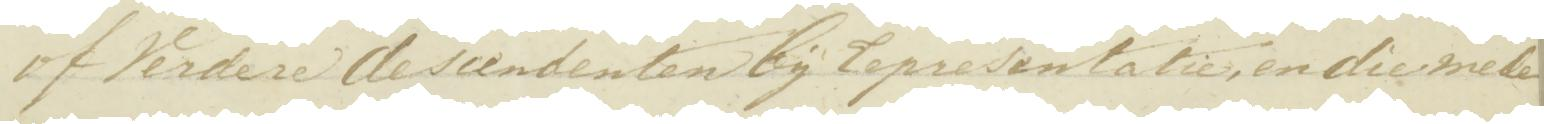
of verdere descendenten bij representatie, en die mede
